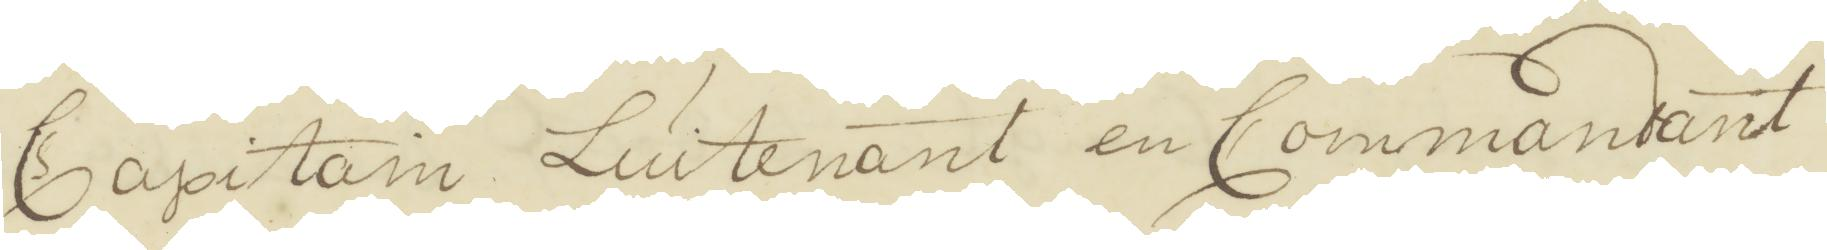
Capitain Luitenant en Commandant
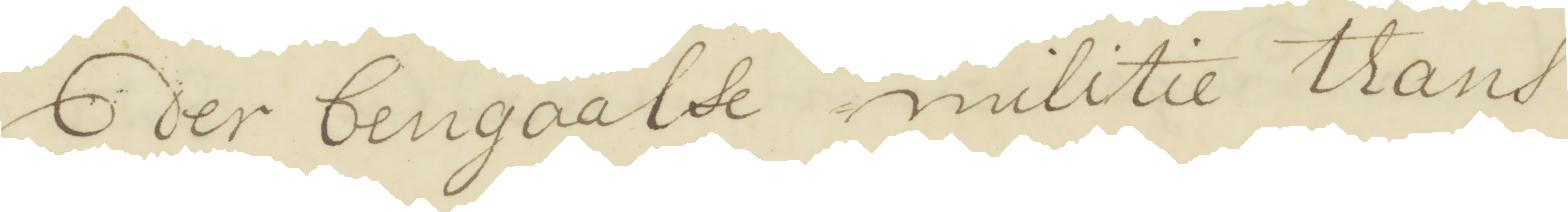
der bengaalse militie thans
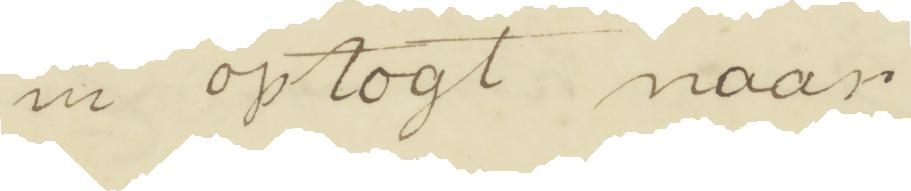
in optogt naar
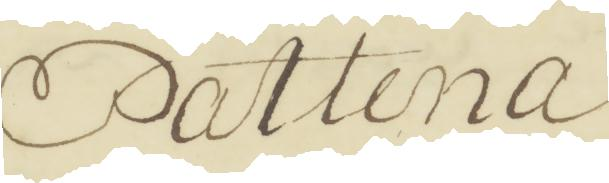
Pattena
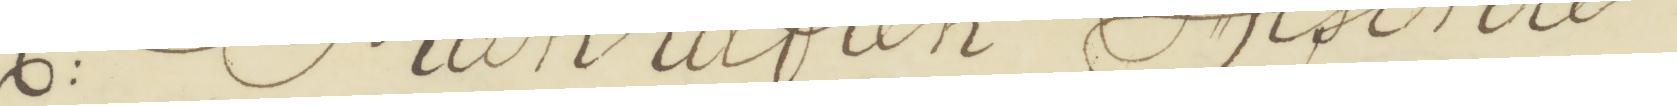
s: Manhaften Discrete
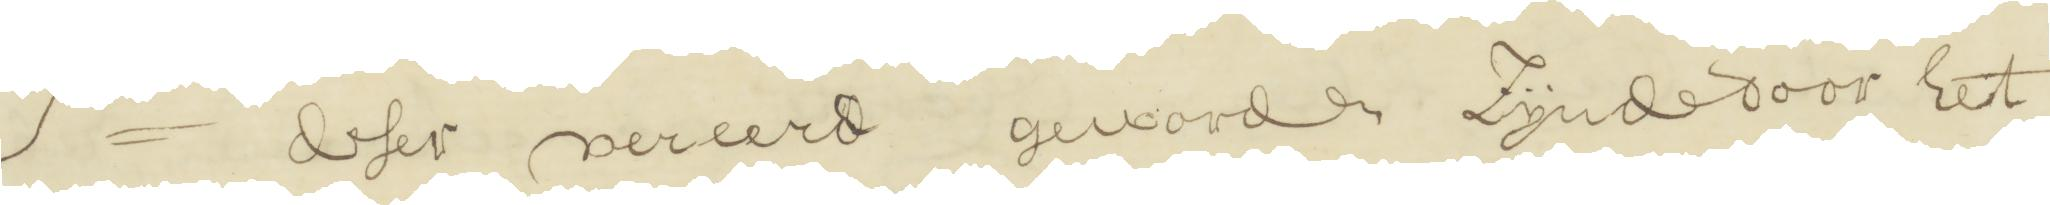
P=mo deser vereerd geworden zijnde door het
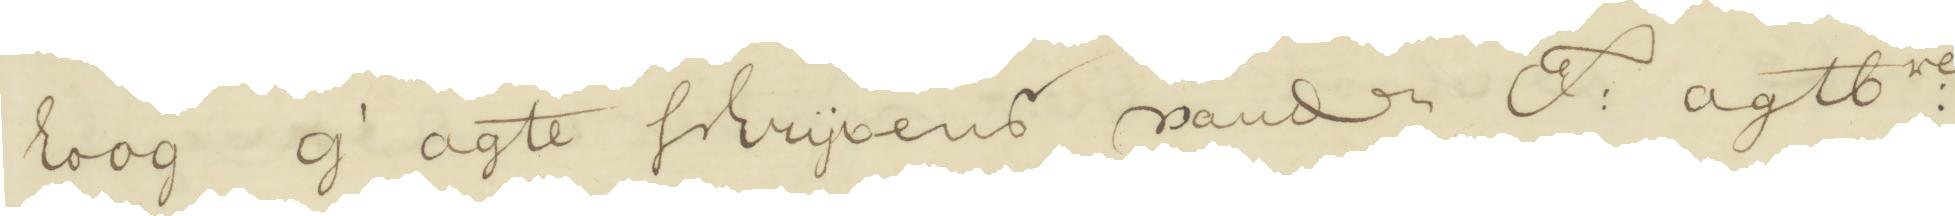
hoog g’ agte schrijvens vanden E: agtbr
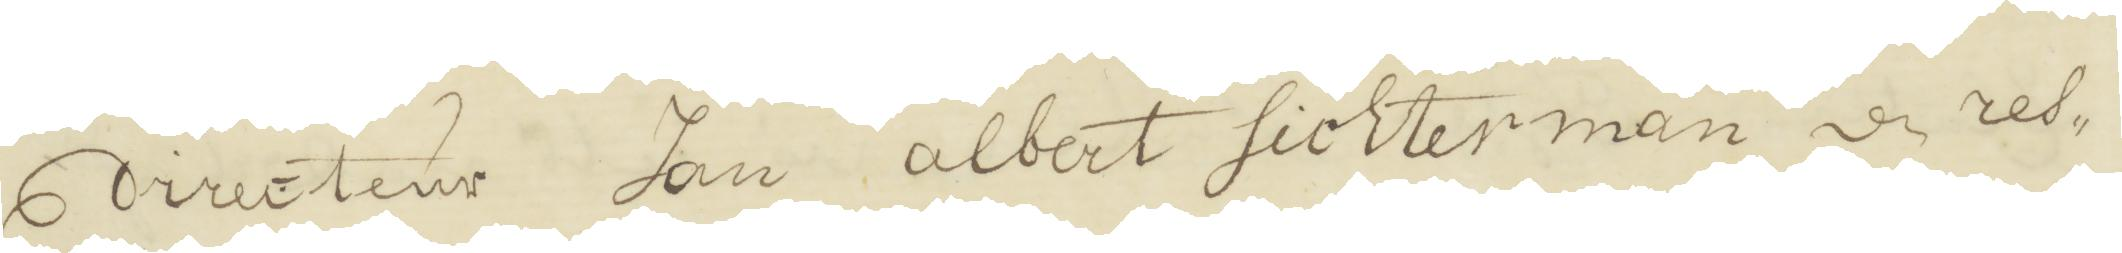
directeur Jan albert sichterman en res„
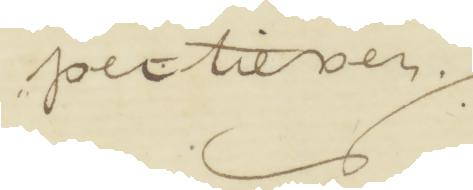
pectieven.
